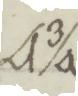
4¾
